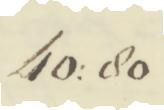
40:80
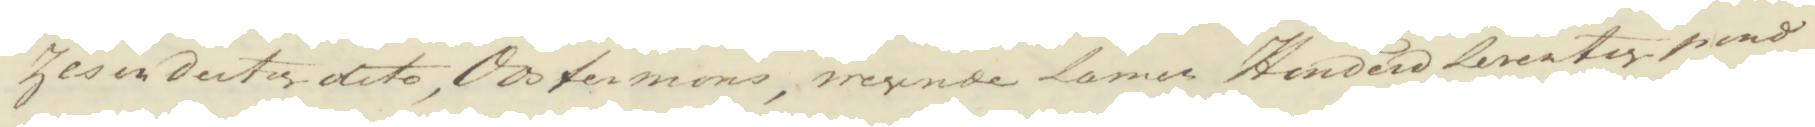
Zes en dertig dito, Oostermons, wegende zamen Honderd zeventig pond
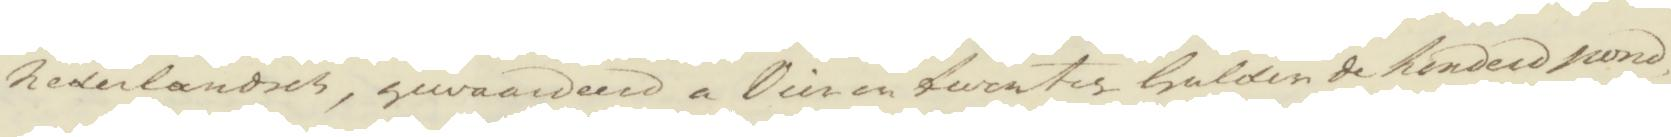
nederlandsch, gewaardeerd a Vier en twintig Gulden de honderd pond
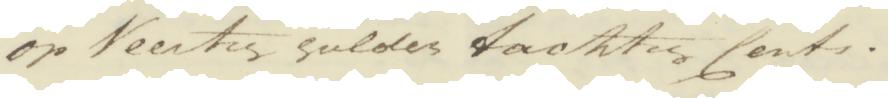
op Veertig gulden tachtig Cents.
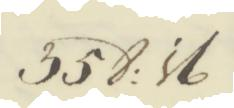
358:16
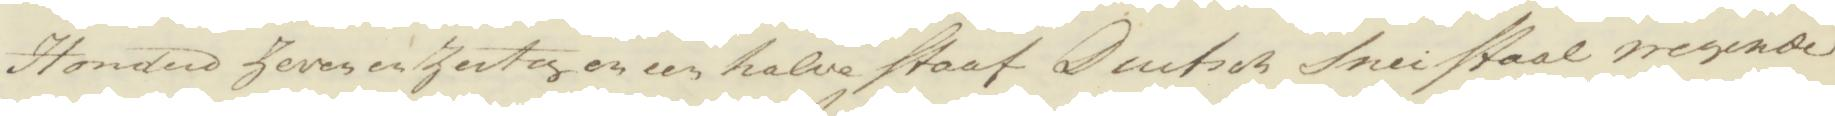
Honderd Zeven en Zestig en een halve staaf Duitsch Sneistaal wegende
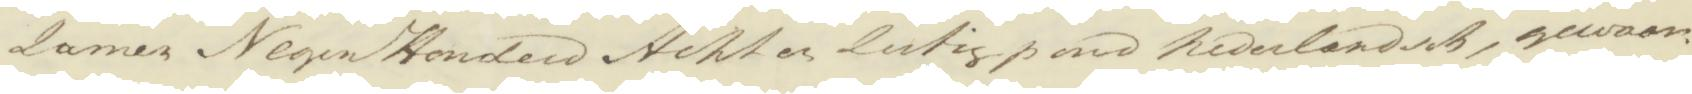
zamen Negen Honderd Acht en zestig pond nederlandsch, gewaar
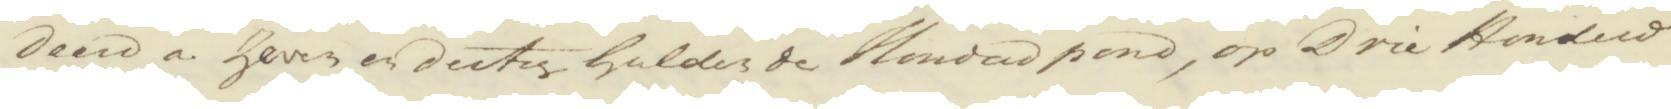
deerd a Zeven en dertig Gulden de Honderd pond, op Drie Honderd
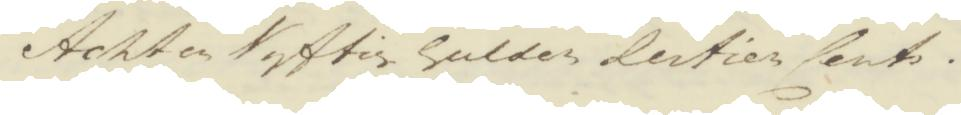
Acht en Vyftig Gulden zestien Cents
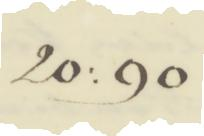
20: 90
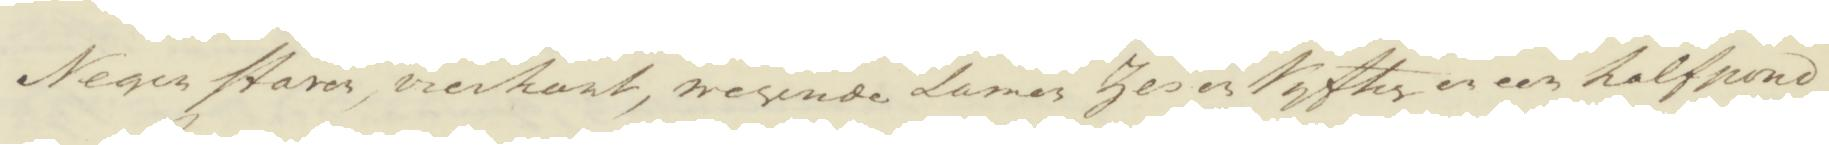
Negen staven, vierkant, wegende zamen Zes en Vyftig en een halfpond
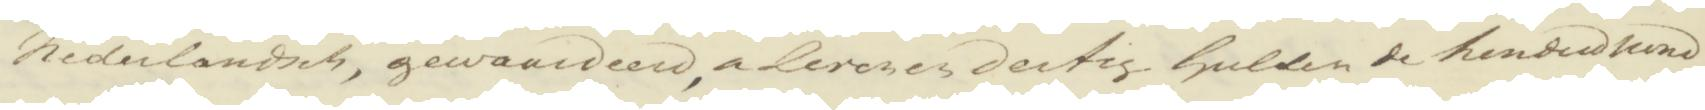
Nederlandsch, gewaardeerd, a zeven en dertig Gulden de honderd pond
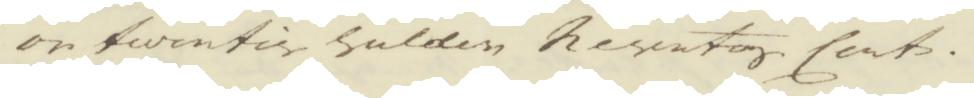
op twintig Gulden Negentig Cents.
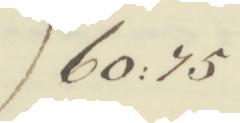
60:75
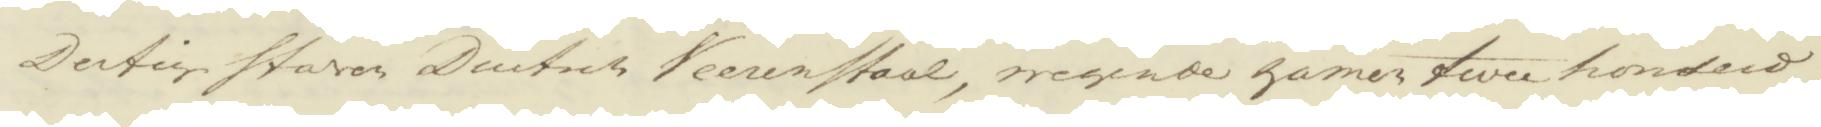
Dertig staven Duitsch Veerenstaal, wegende zamen twee honderd
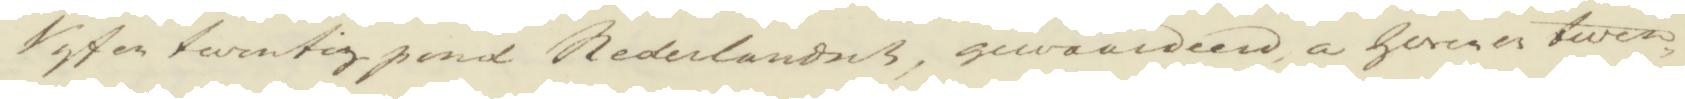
Vyf en twintig pond Nederlandsch, gewaardeerd, a zeven en twin„
